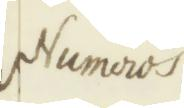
Numero's
